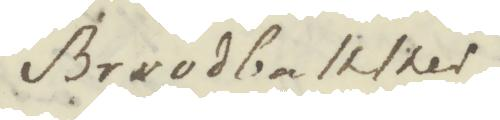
Broodbakker
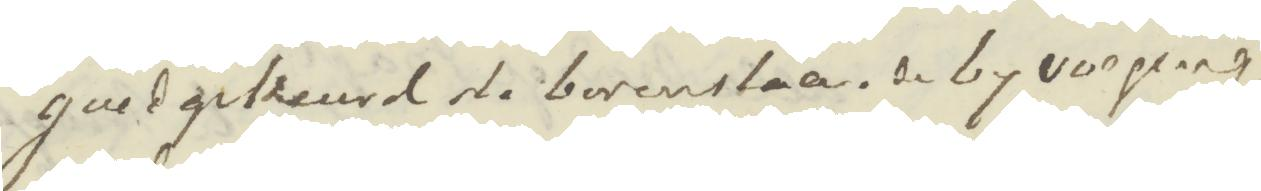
goed gekeurd de bovenstaan de by voeging
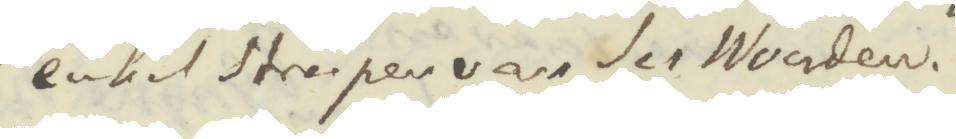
enhet streepen van ses woorden.
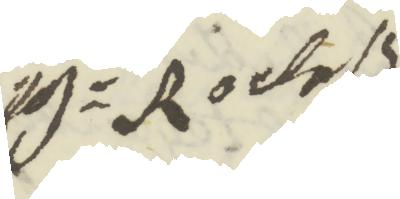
P= Roelofs
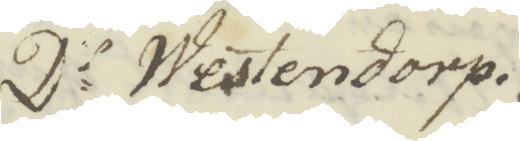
D=s Westendorp.
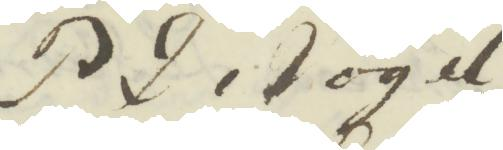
P De Vogel
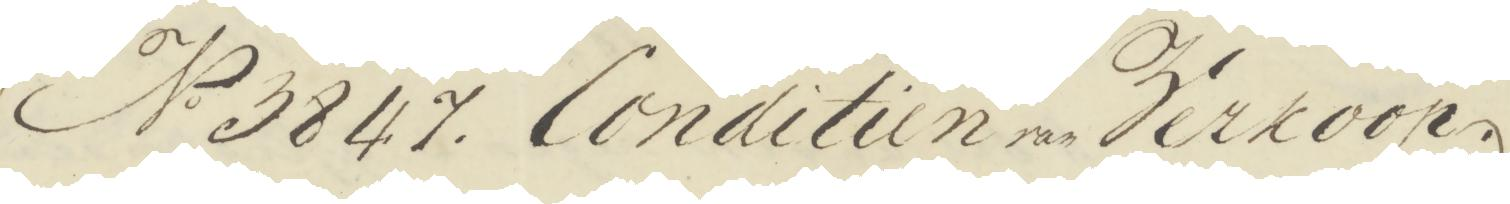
No 3847. Conditien van Verkoop
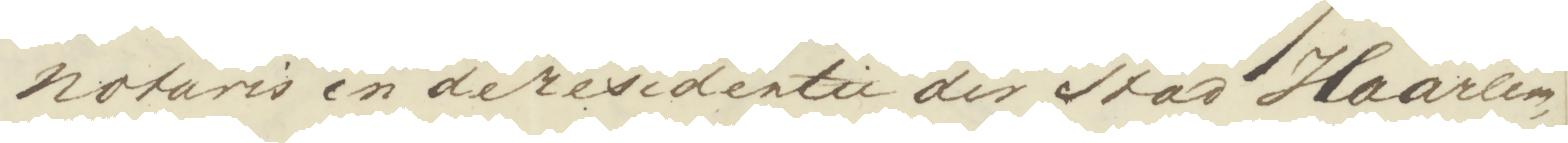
notaris in de residentie der stad Haarlem,
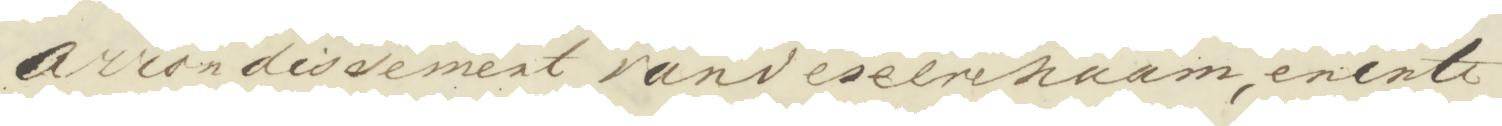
arrondissement van deselve naam, en inte
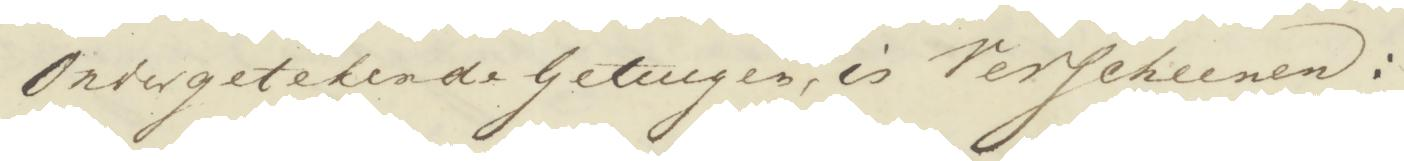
Ondergetekende Getuigen, is Verscheenen:
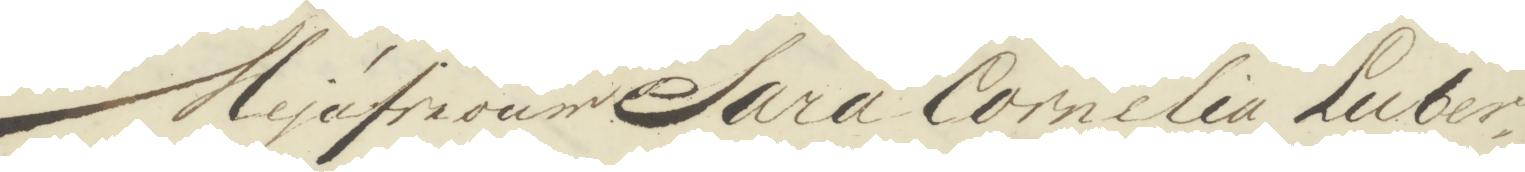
Mejufvrouw Sara Cornelia Luber,
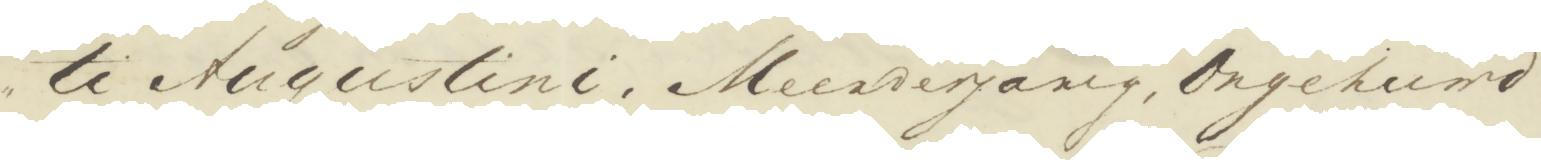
„ti Augustini, Meerderjarig, Ongehuwd
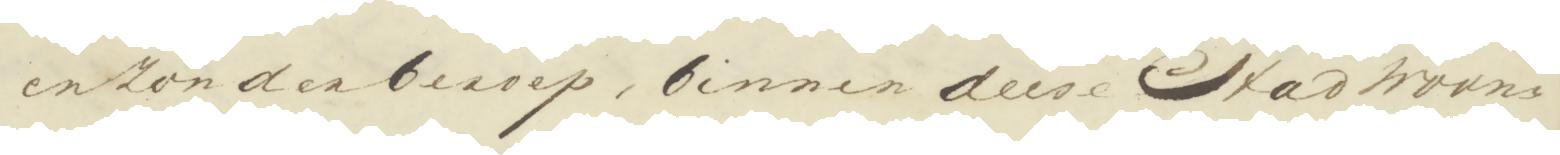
en zonder beroep, binnen deese Stad woon
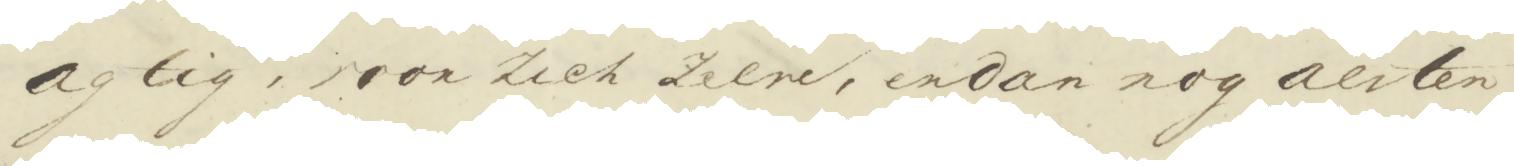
agtig, voor zich zelve, en dan nog als ten
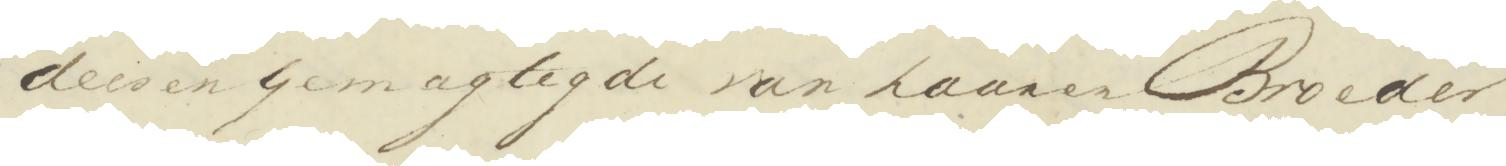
deesen Gemagtigde van haaren Broeder
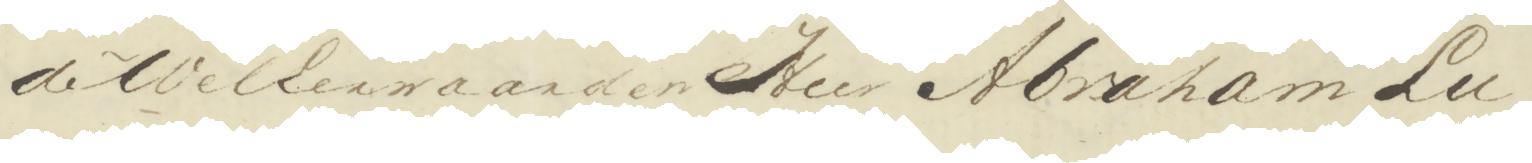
de WelEerwaarden Heer Abraham Lu
